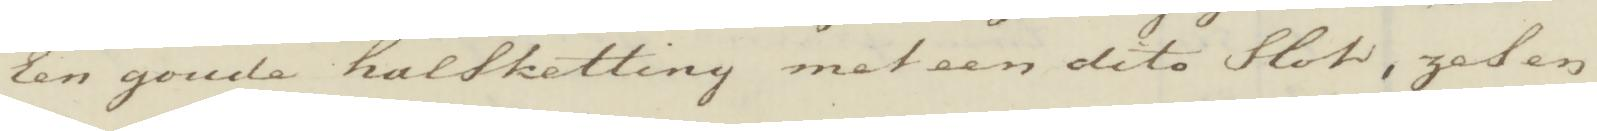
Een goude halsketting met een dito Slot, zes en
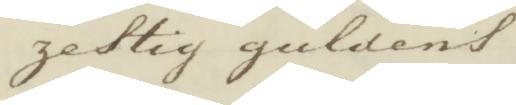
zestig guldens
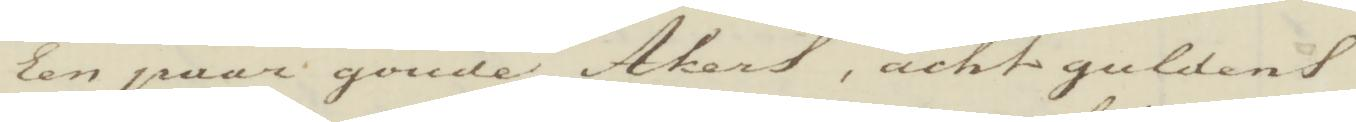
Een paar goude Akers, acht guldens
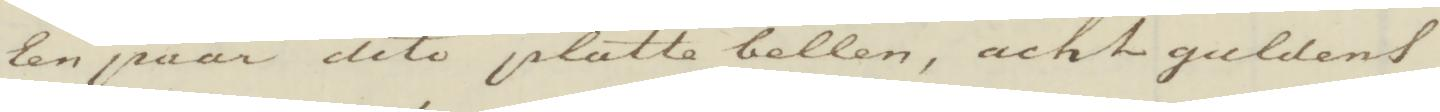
Een paar dito platte bellen, acht guldens
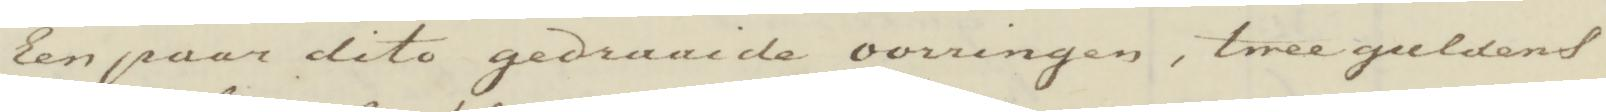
Een paar dito gedraaide oorringen, twee guldens
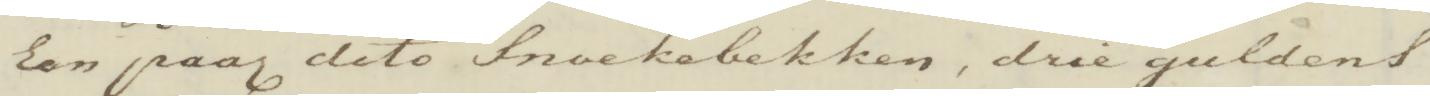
Een paar dito Snoekebekken, drie guldens
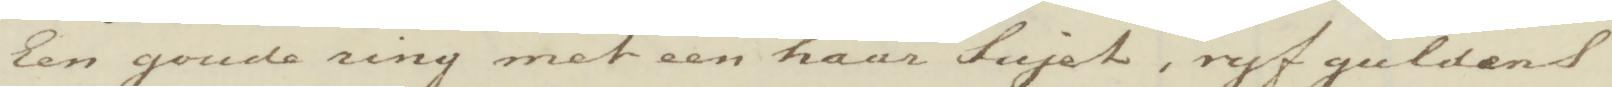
Een goude ring met een haar Sujet, vyf guldens
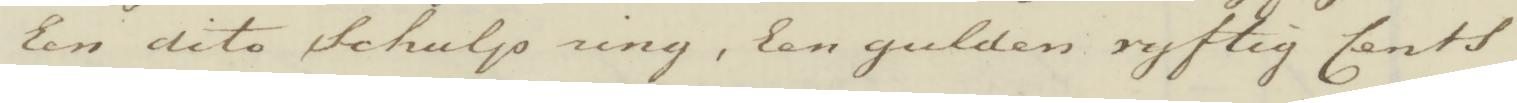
Een dito schulp ring, Een gulden vyftig Cents
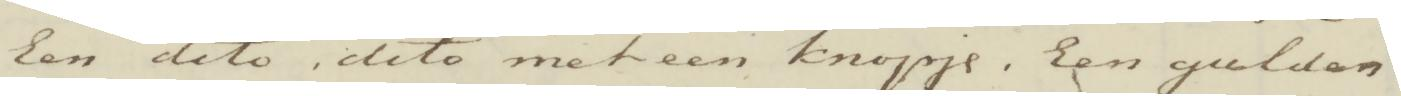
Een dito, dito met een knopje, Een gulden
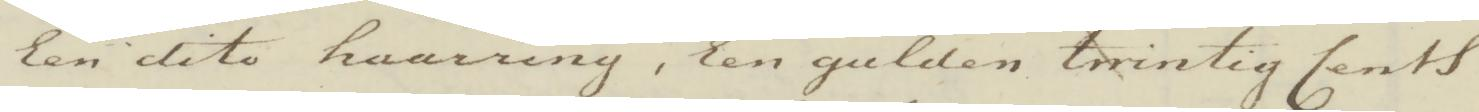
Een dito haarring, Een gulden twintig Cents
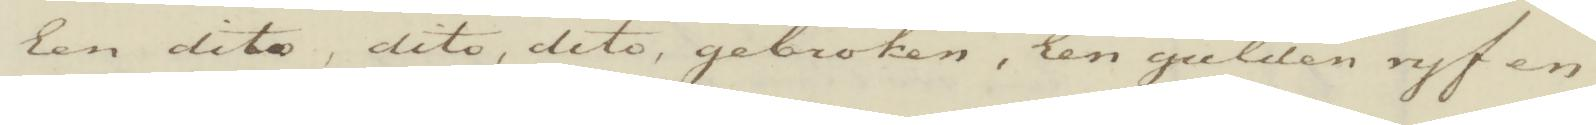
Een dito, dito, dito, gebroken, Een gulden vyf en
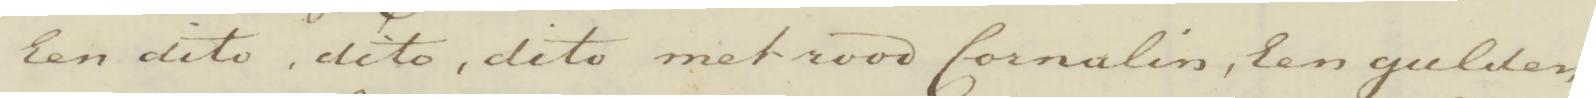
Een dito, dito, dito met rood Cornalin, Een gulden
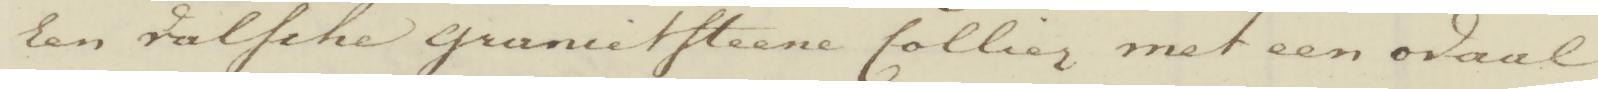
Een valsche granietsteene Collier met een ovaal
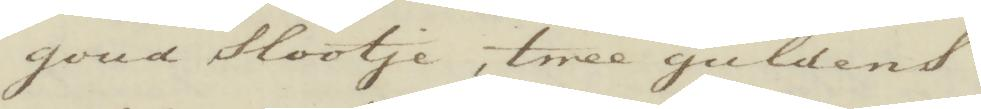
goud slootje, twee guldens
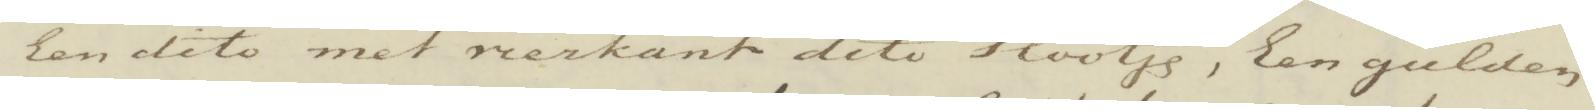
Een dito met vierkant dito slootje, Een gulden
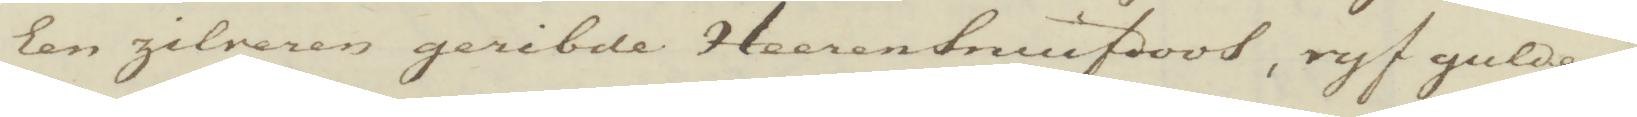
Een zilveren geribde Heeren Snuifdoos, vyf guldens
